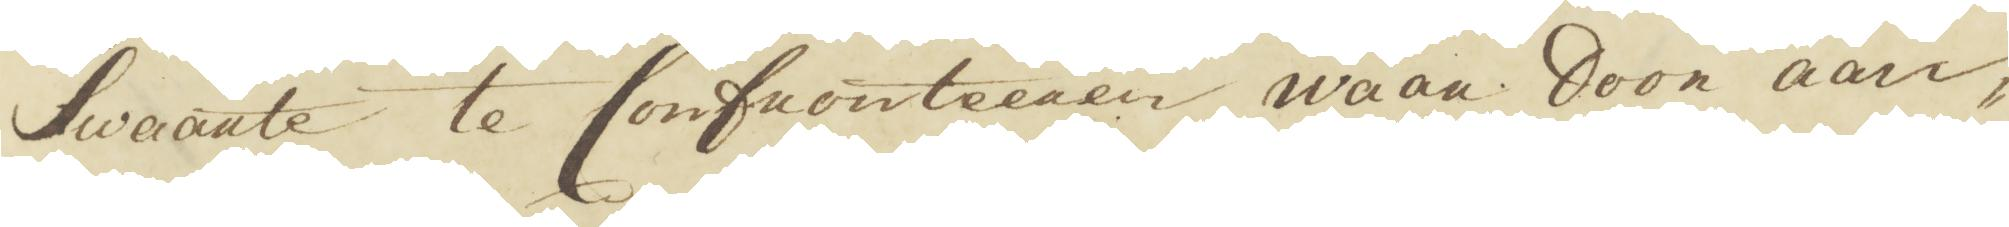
swaarte te Confronteeren waar door aan„
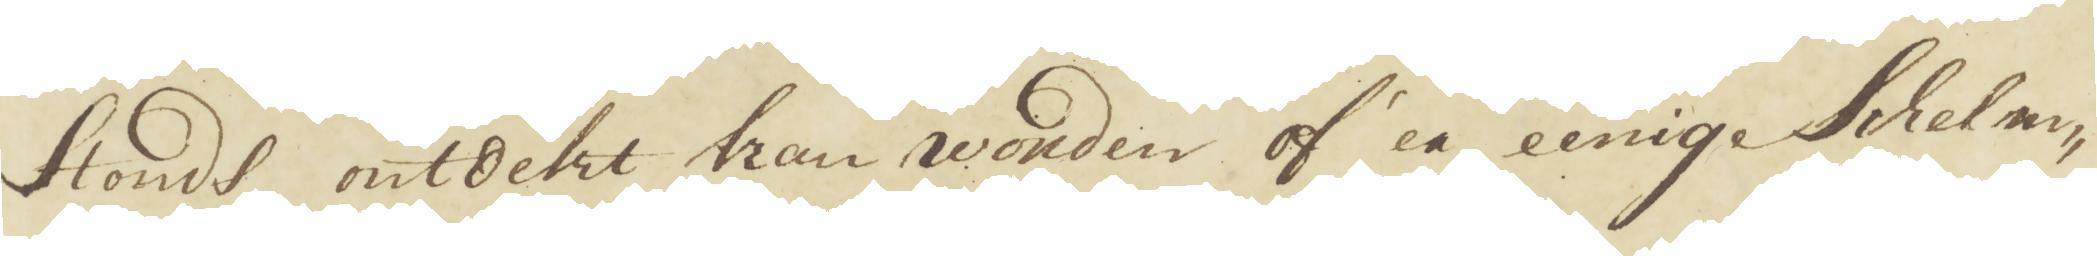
stonds ontdekt kan worden of 'er eenige schelm„
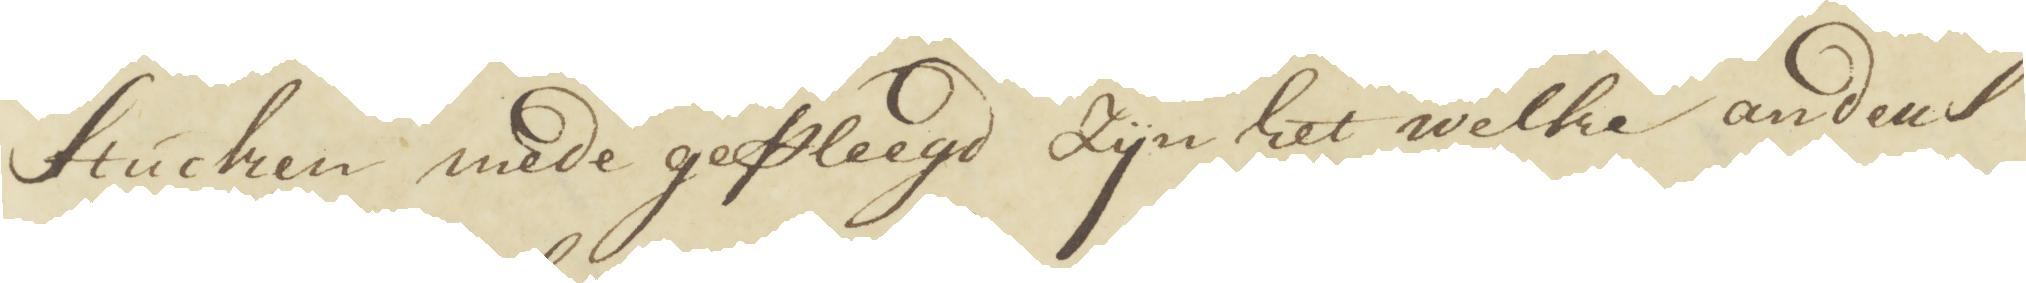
stucken mede gepleegd zijn het welke anders
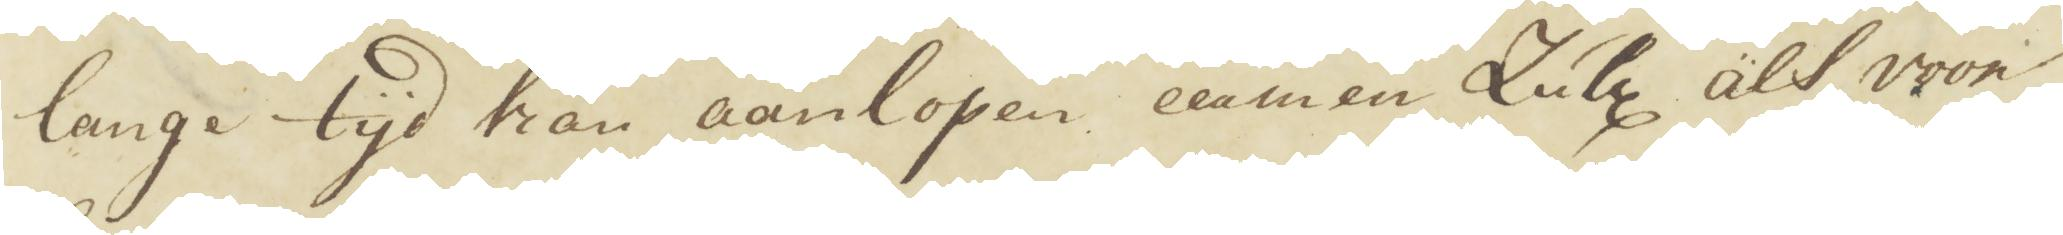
lange tijd kan aanlopen eermen zulx als voor
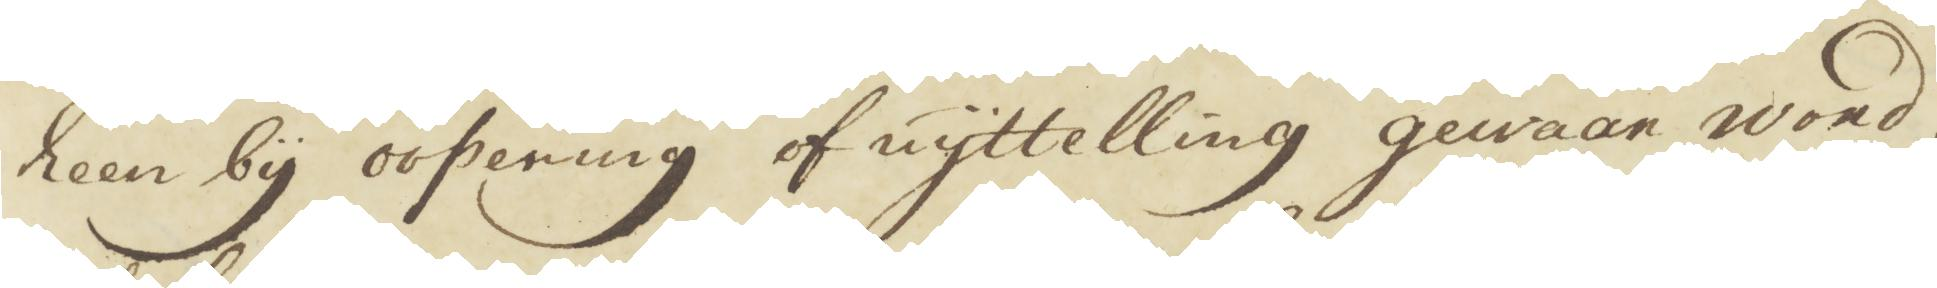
heen bij oopening of uijttelling gewaar word,
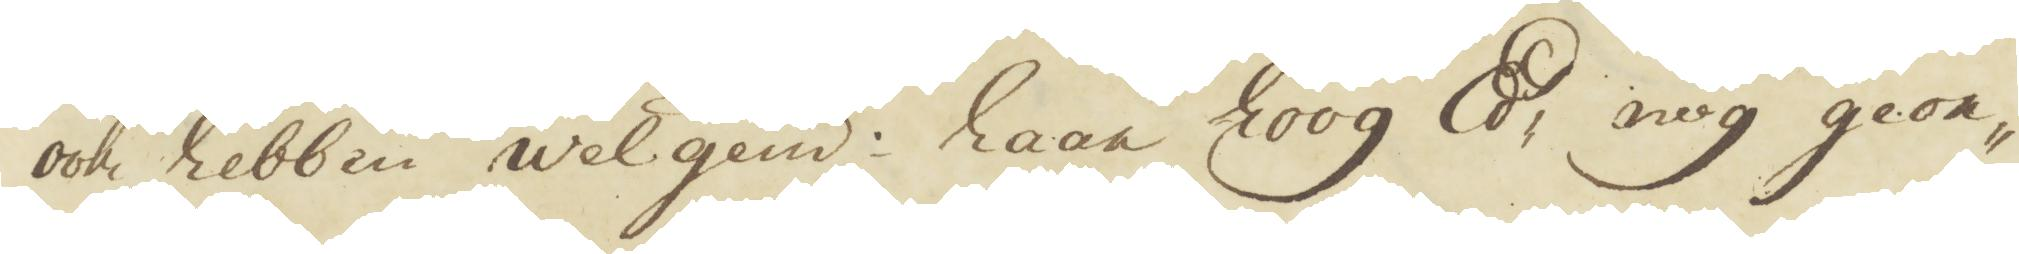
ook hebben wel gem: haar hoog Ed„ nog geor„
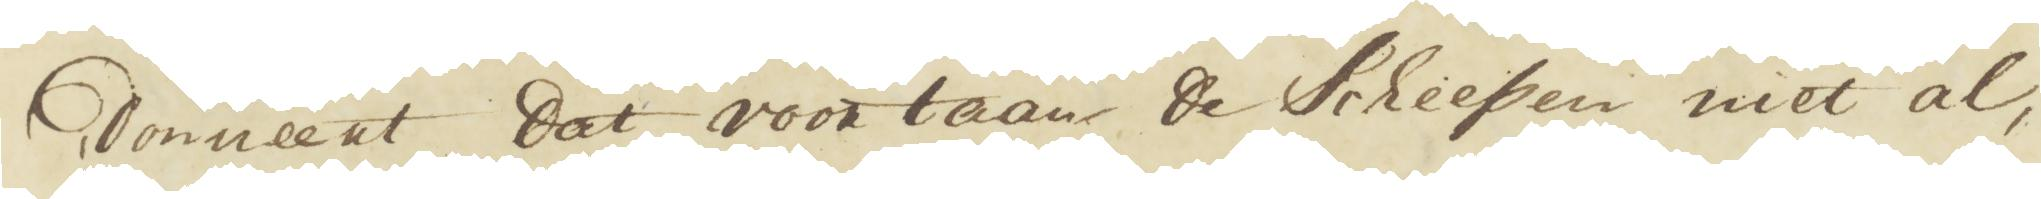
donneert dat voortaan de scheepen niet al„
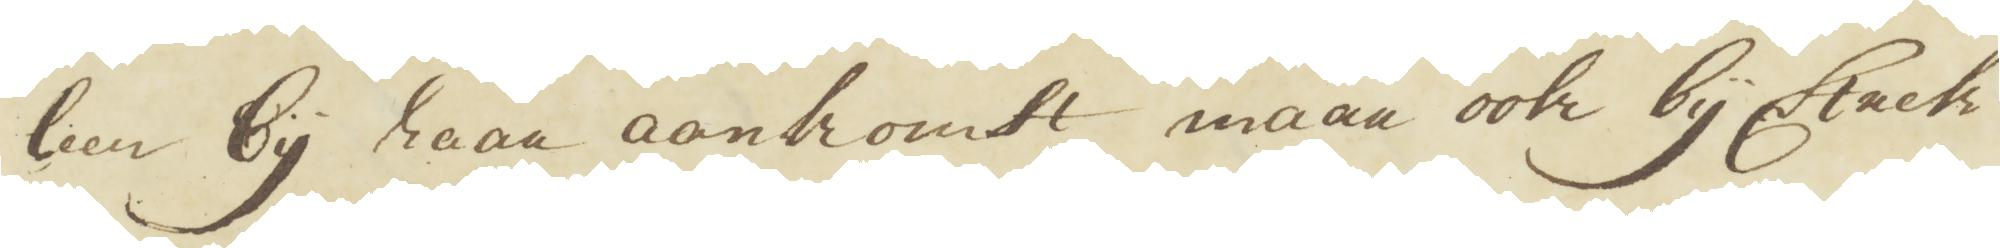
leen bij haar aankomst maar ook bij vertrek
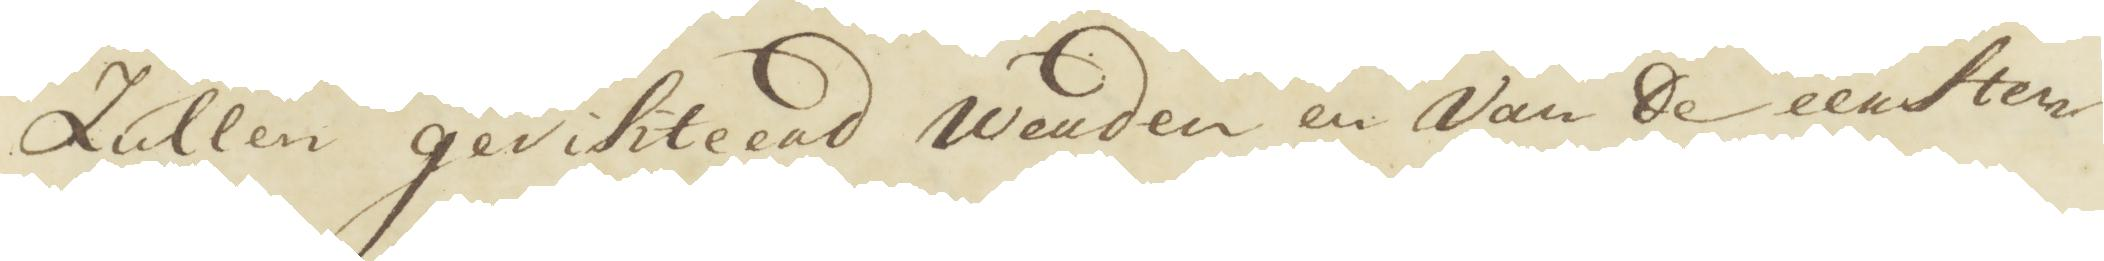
zullen gevisiteerd werden en van de eersten
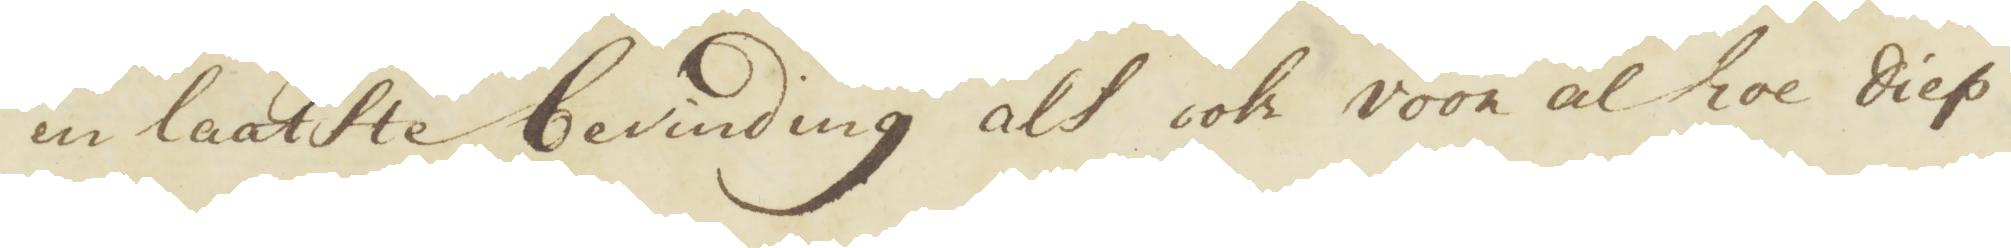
en laatste bevinding als ook voor al hoe diep
